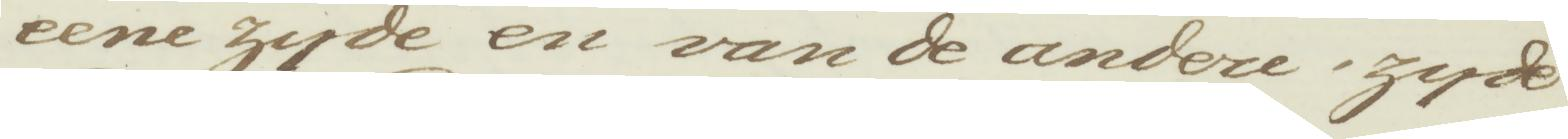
eene zyde en van de andere, zyde
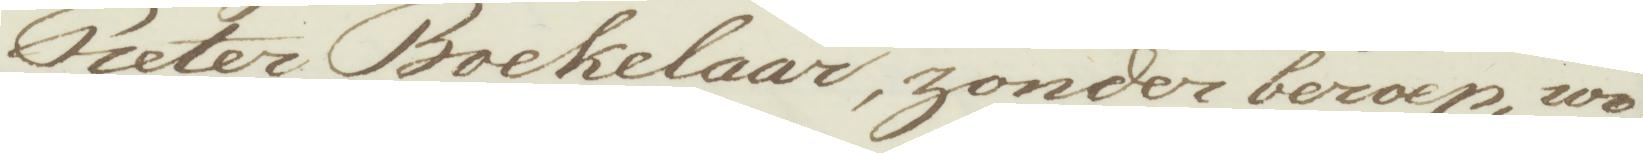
Pieter Boekelaar, zonder beroep, wo
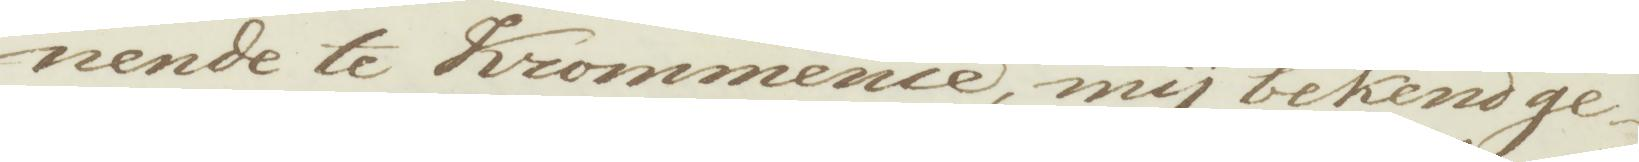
nende te Krommenie, mij bekend ge-
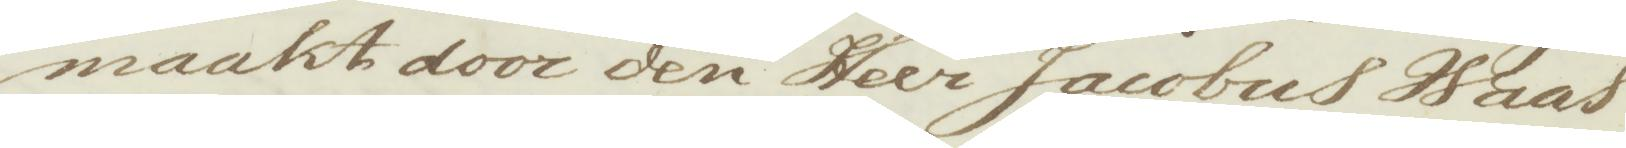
maakt door den Heer Jacobus Waas
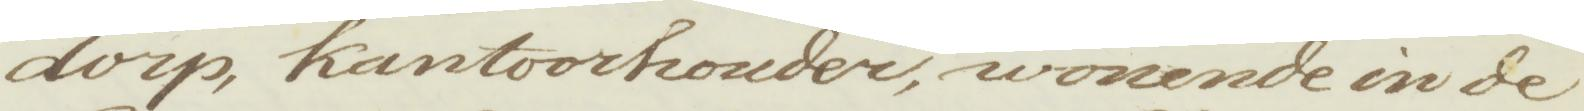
dorp, kantoorhouder, wonende in de
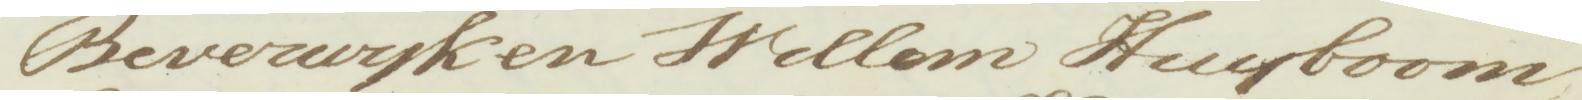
Beverwyk en Willem Huyboom,
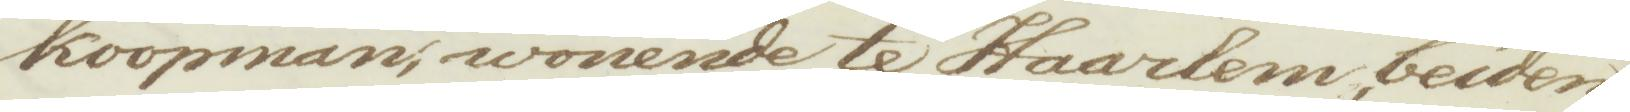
koopman, wonende te Haarlem, beiden
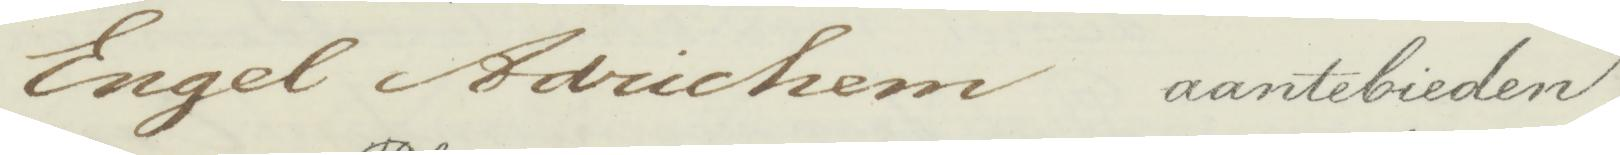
Engel Adrichem aantebieden
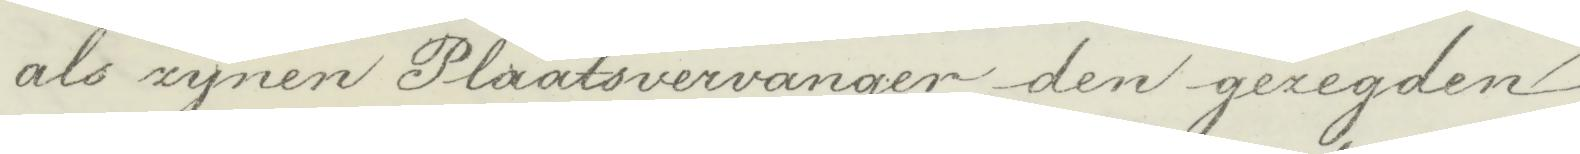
als zijnen Plaatsvervanger den gezegden
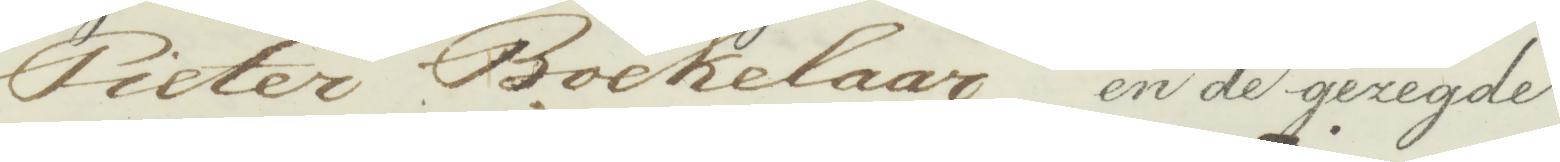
Pieter Boekelaar en de gezegde
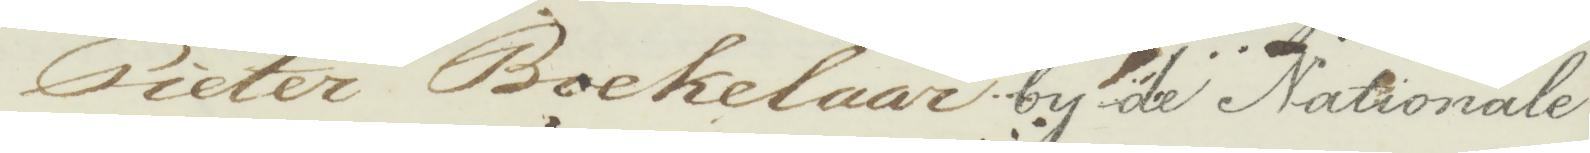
Pieter Boekelaar, by de Nationale
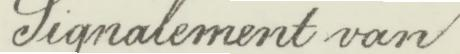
Signalement van
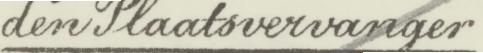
den Plaatsvervanger
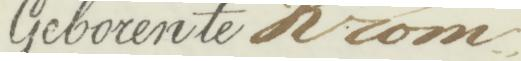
Geboren te Krom
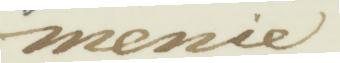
menie
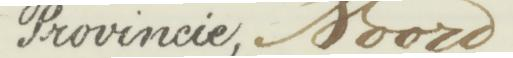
Provincie, Noord
